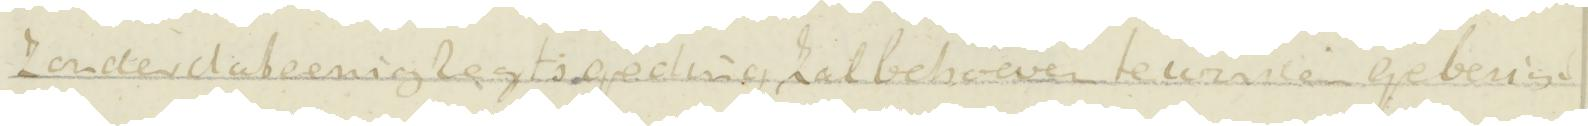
zonder dat eenig regts geding zal behoeven te worden gebezigt
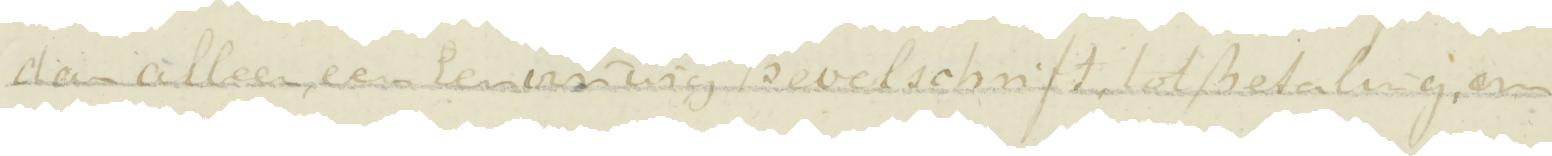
dan alleen, een Eenvormig Bevelschrift, tot Betaling, om
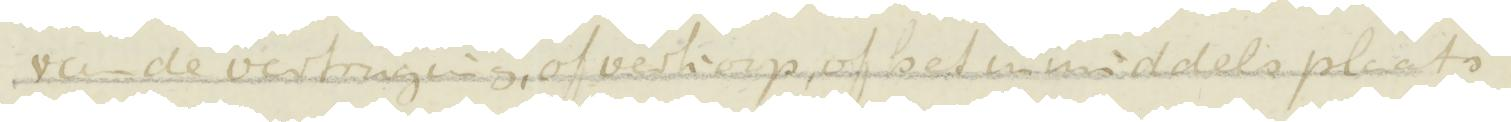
van de vertraging, of verkoop, of het inmiddels plaats
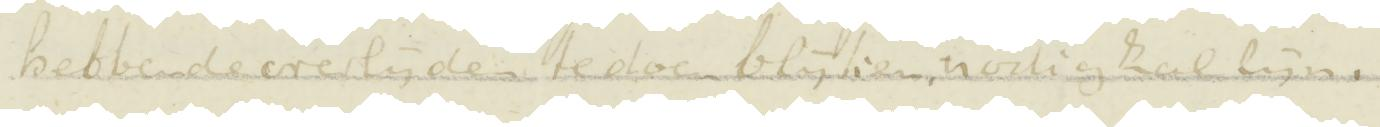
hebbende overlijden te doen blijken, nodig zal zijn.
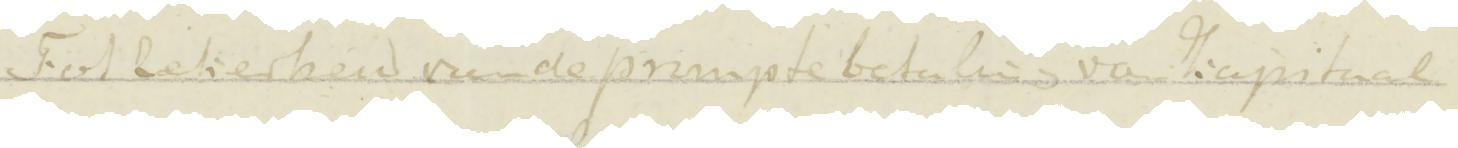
Tot zekerheid van de prompte betaling van kapitaal
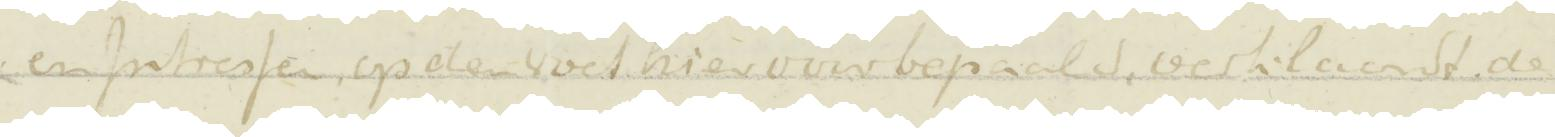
en Jntressen, op den voet hier voor bepaald, verklaardt de
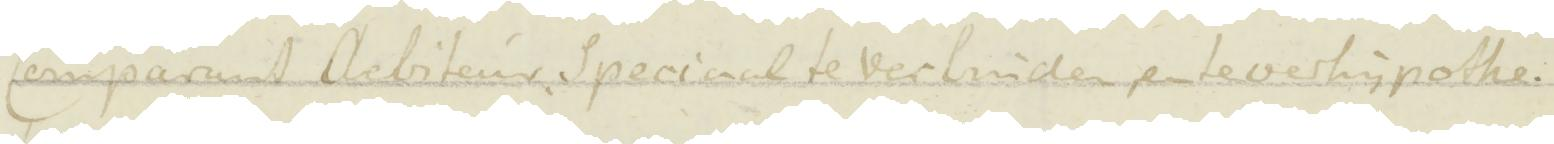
Comparant debiteur Speciaal te verbinden, en te verhijpothe.
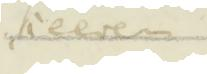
keeren
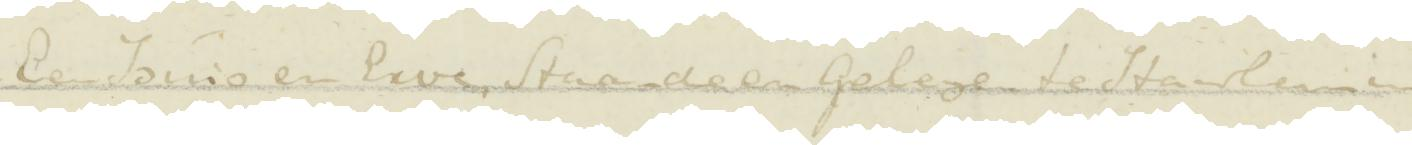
Een huis en Erve staande en gelegen te Haarlem in
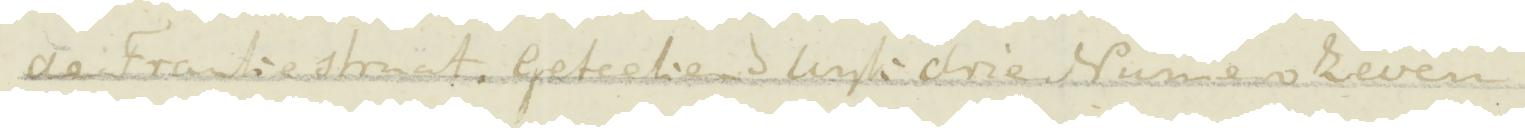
de Frankestraat. Getekend wyk drie Numero zeven
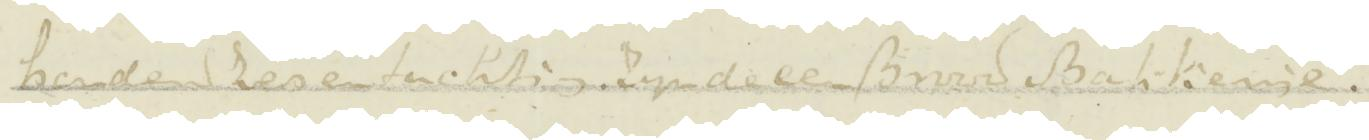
honderd zesentachtig. zyn de een Brood Bakkerije.
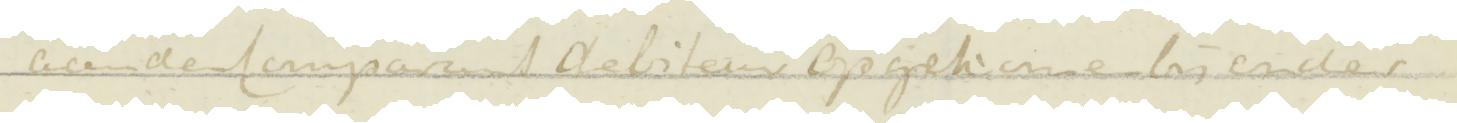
aan de Comparant debiteur op gekomen bij en des
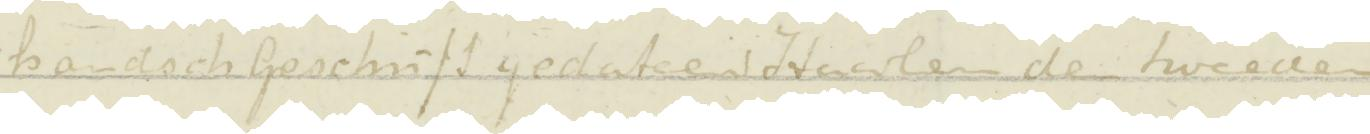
handsch Geschrift gedateerd Haarlem de tweeden
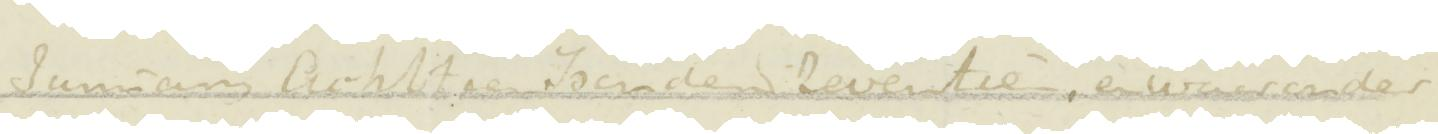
Januarij Achttien honderd zeventien, en waeronder
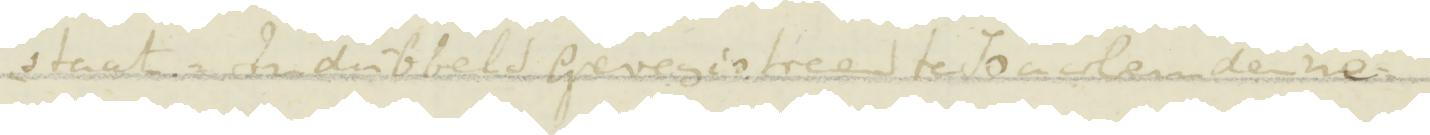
staat. = Jn dubbeld Geregistreerd te Haarlem den ne=
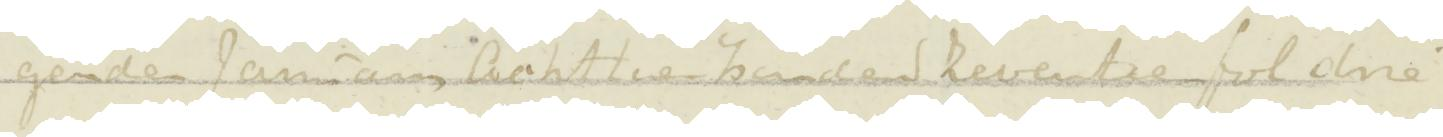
genden January Achttien honderd zeventien fol drie
